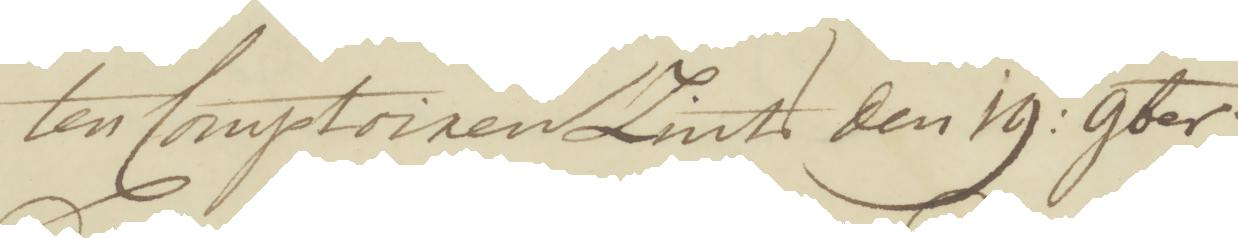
ten Comptoiren zints den 19:' gber:
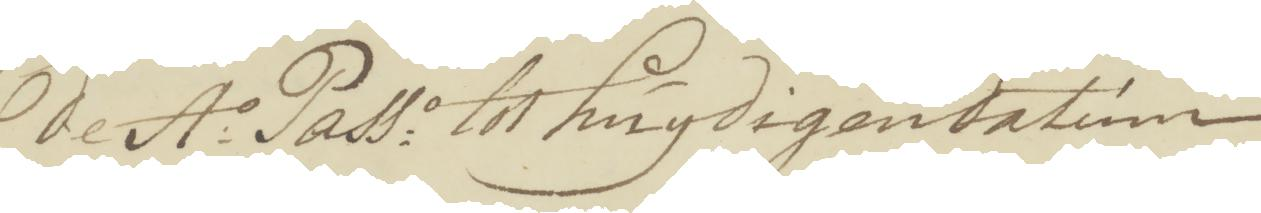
de A:o Pass:o tot huijdigendatum
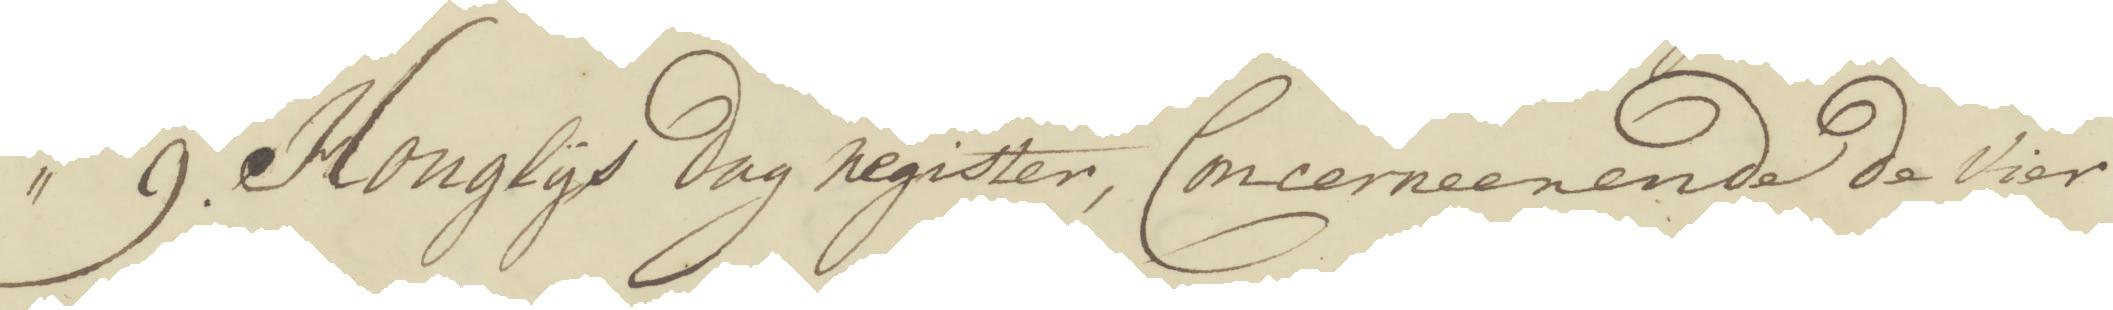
„ 9. Honglijs dag register, Concerneerende de vier
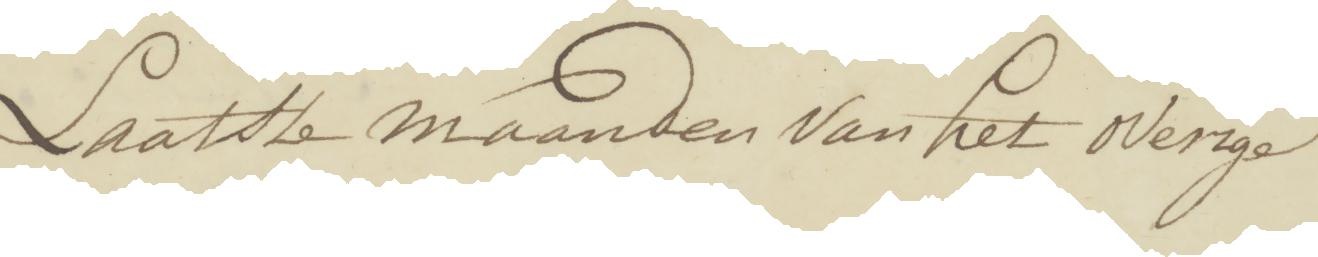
Laatste maanden van het overige
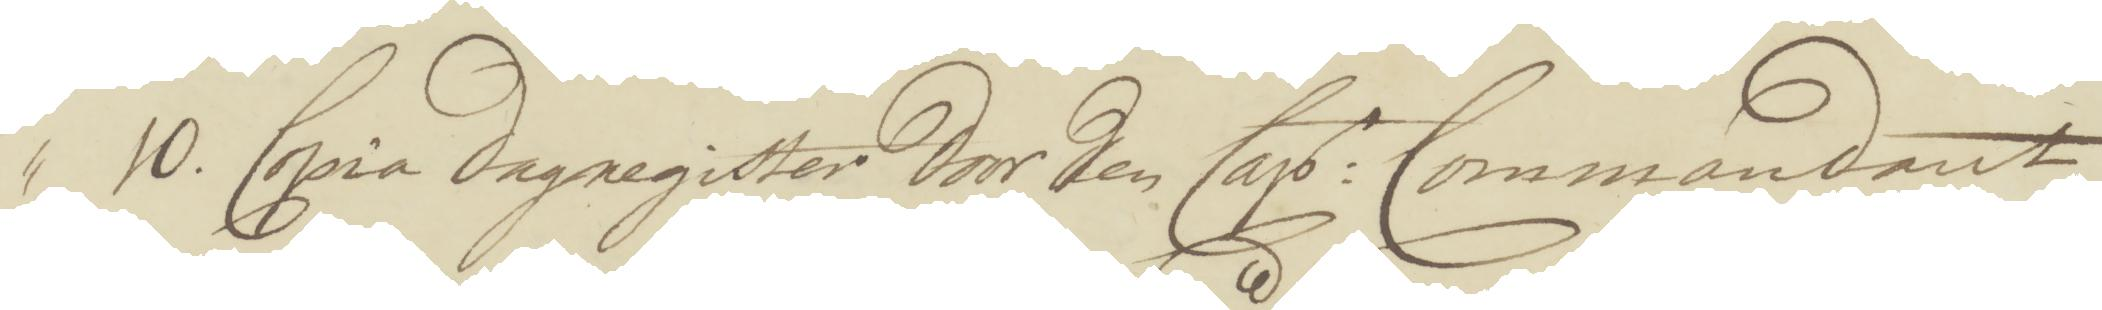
„ 10. Copia dagregister door den Cap:t Commandant
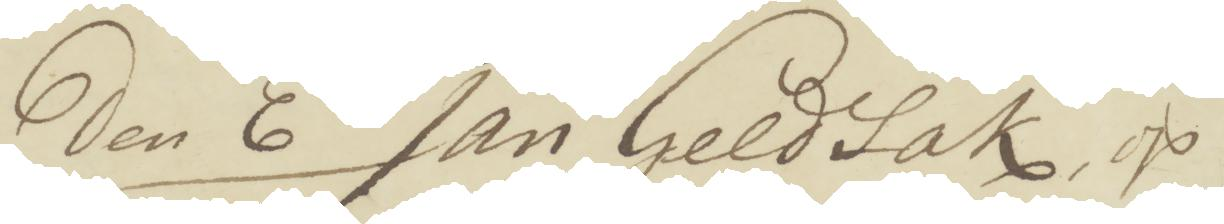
den Ed Jan Geldsak, op
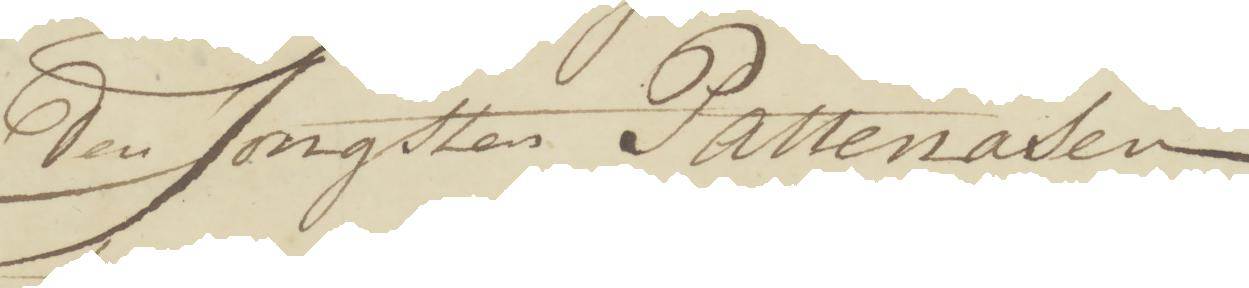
den Jongsten Pattenasen
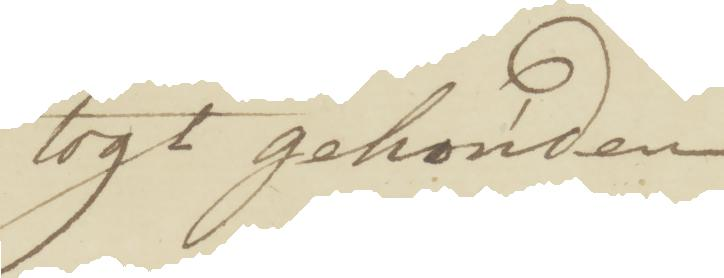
togt gehouden
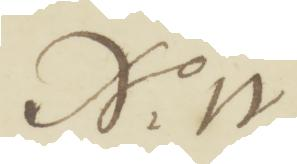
N:o 11
